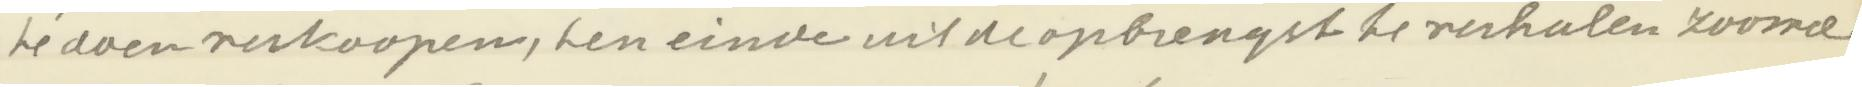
te doen verkoopen, ten einde uit de opbrengst te verhalen zoowel
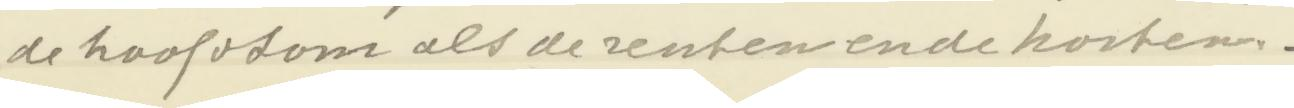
de hoofdzom als de renten ende kosten-
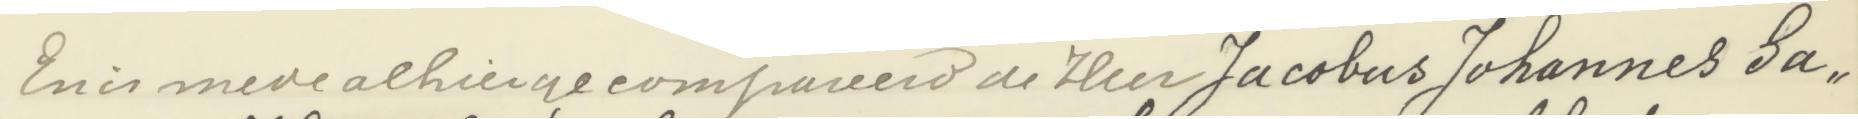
En is mede alhier gecompareerd de Heer Jacobus Johannes Sa„
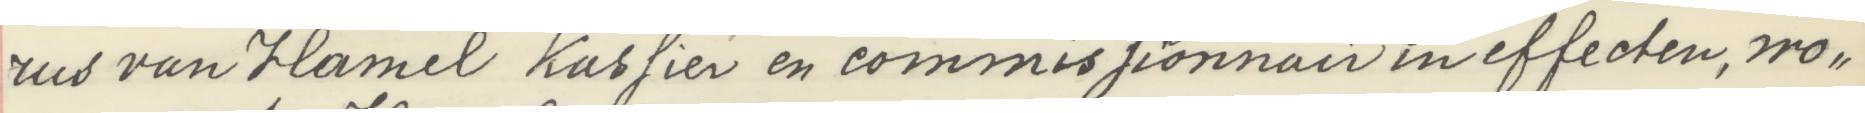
rus van Hamel Kassier en commissionnair in effecten, wo„
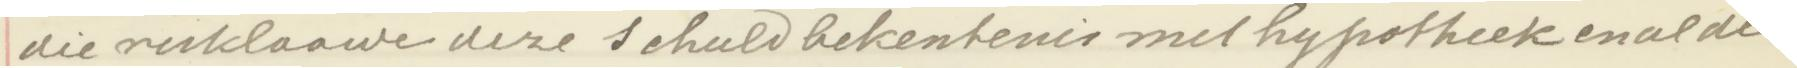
die verklaarde deze schuld bekentenis met hypotheek en al de
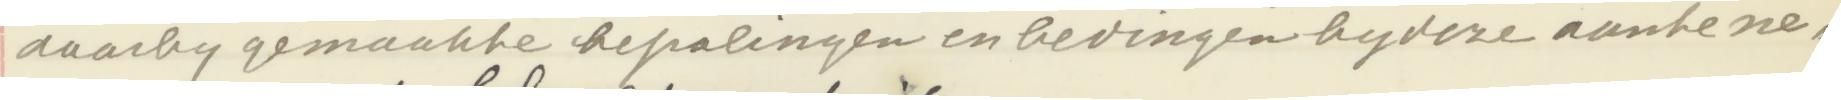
daarby gemaakte bepalingen en bedingen by deze aantene„
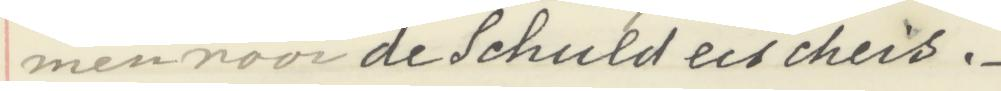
men voor de schuld eischers.
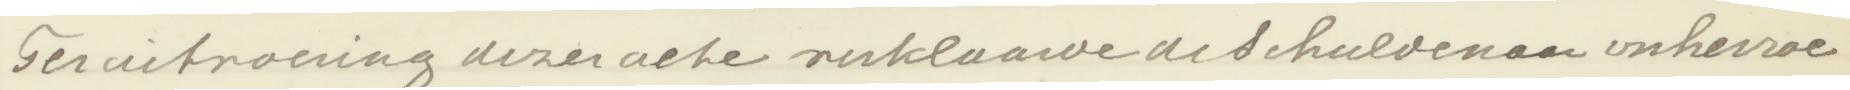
Ter uitvoering dezer acte verklaarde de schuldenaar onherroe
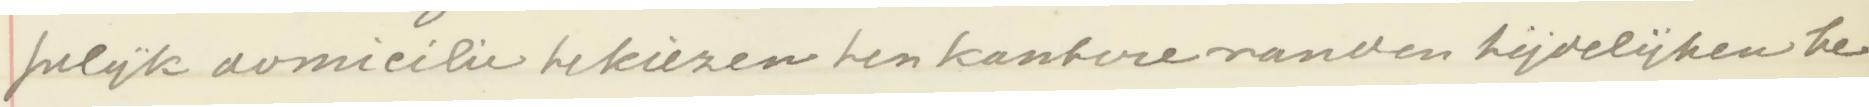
pelijk domicilie te kiezen ten kantore van den tijdelijken be
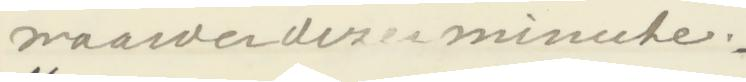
waarder dezer minute.
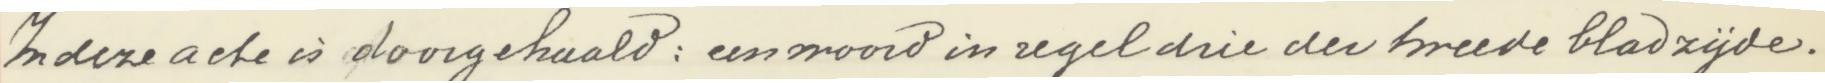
In deze acte is doorgehaald: een woord in regel drie der tweede bladzijde.
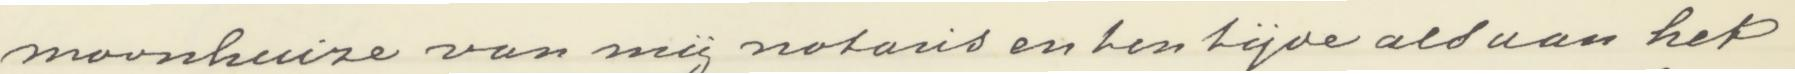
woonhuize van mij notaris en ten tijde als aan het
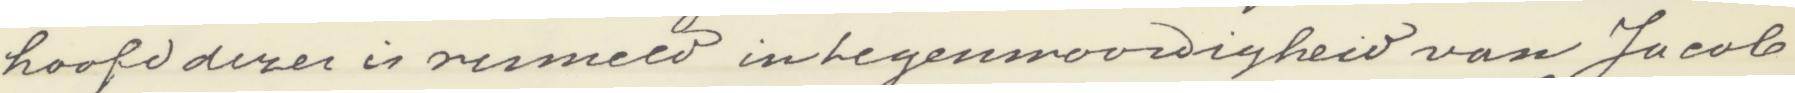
hoofd dezes is vermeld in tegenwoordigheid van Jacob
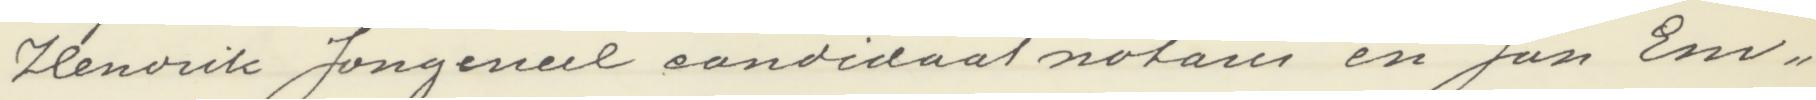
Hendrik Jongeneel candidaat notaris en Jan Em„
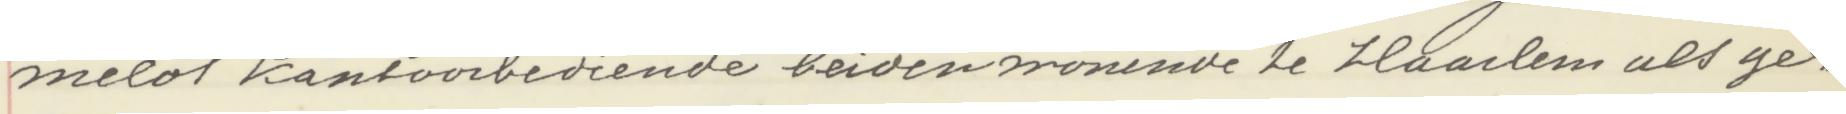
melos kantoorbediende beiden wonende te Haarlem als ge„
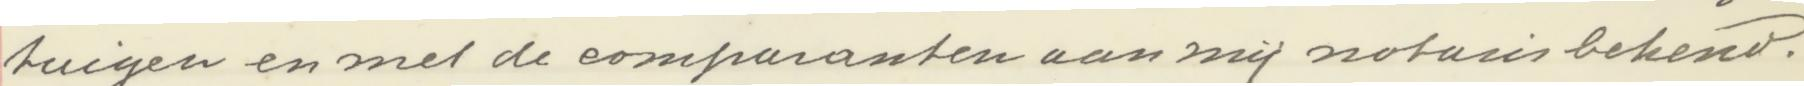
tuigen en met de comparanten aan mij notaris bekend.
